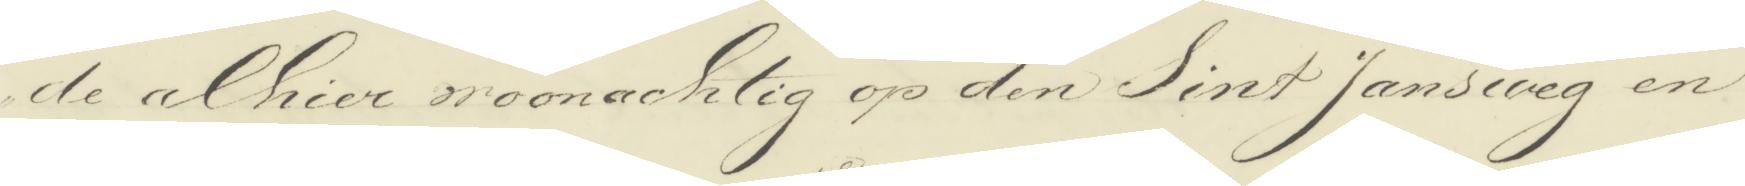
de alhier woonachtig op den Sint Jansweg en
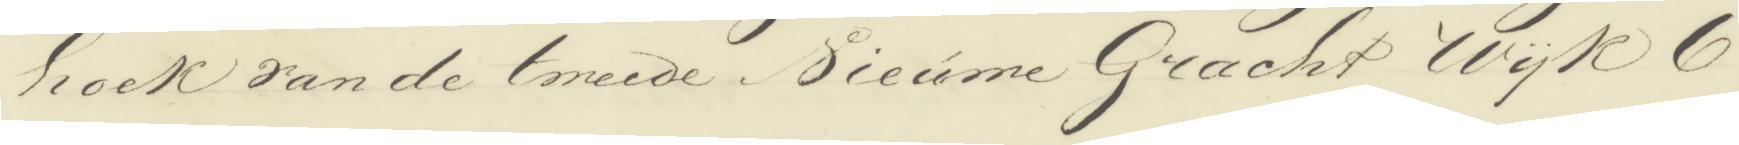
hoek van de tweede Nieuwe Gracht Wijk 6
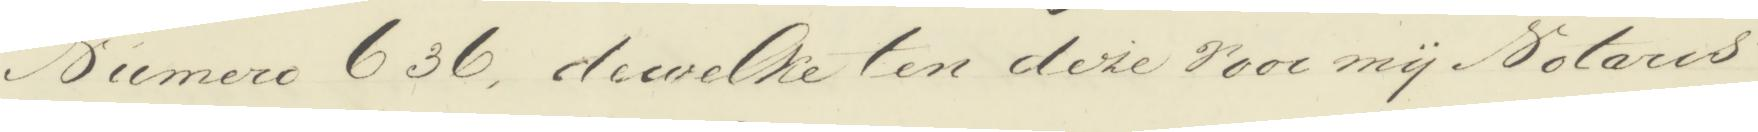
Numero 636, dewelke ten deze Voor mij Notaris
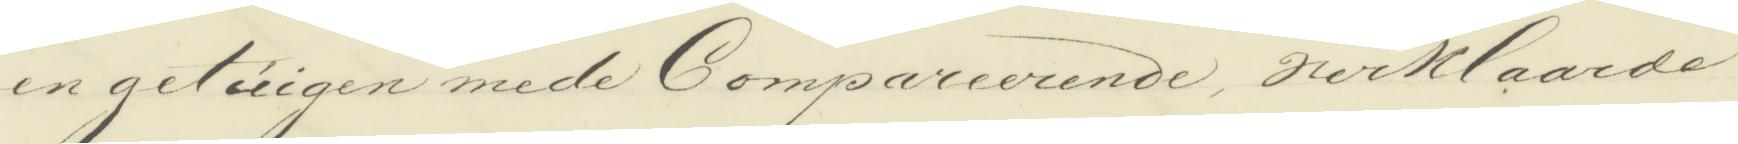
en getuigen mede Compareerende, verklaarde
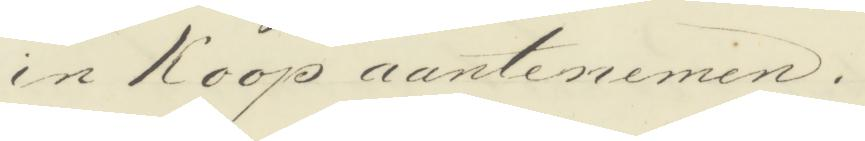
in koop aantenemen.
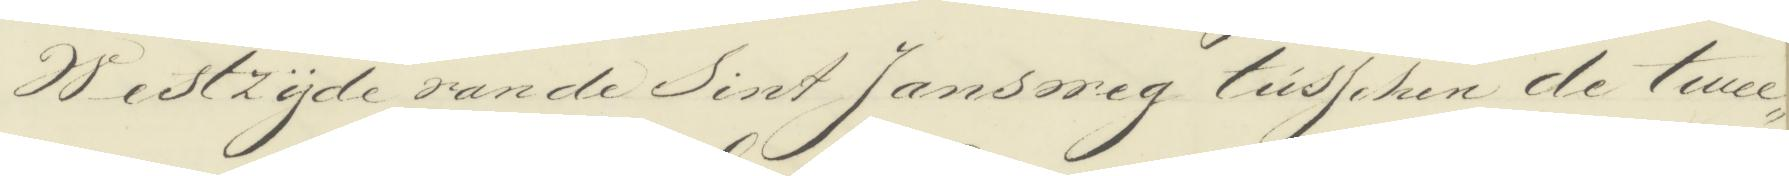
Westzijde van de Sint Jansweg tusschen de twee„
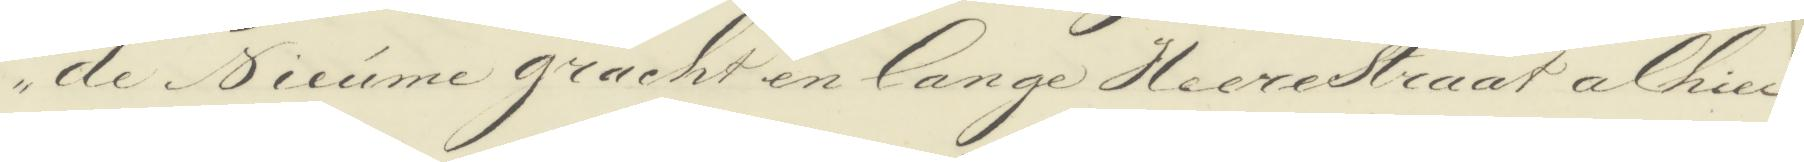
„de Nieuwe gracht en lange Heerestraat alhier
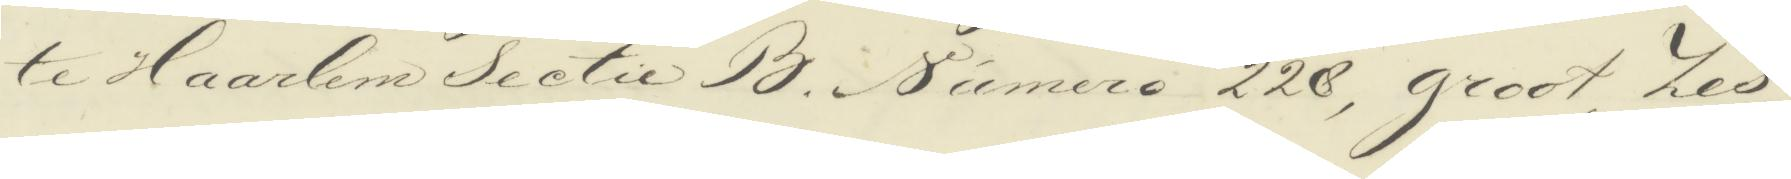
te Haarlem Sectie B. Numero 228, groot, Zes
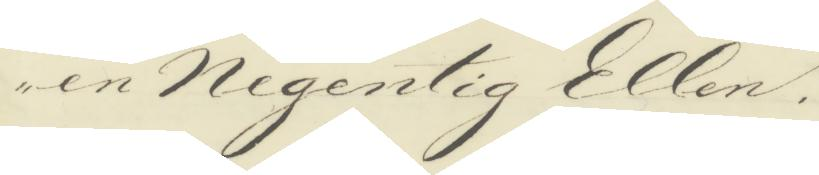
„en Negentig Ellen.
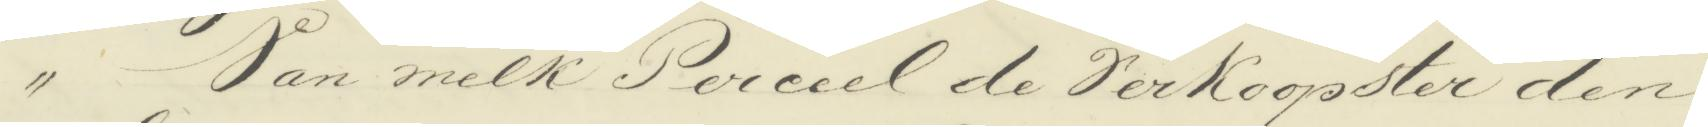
„ Van welk Perceel de Verkoopster den
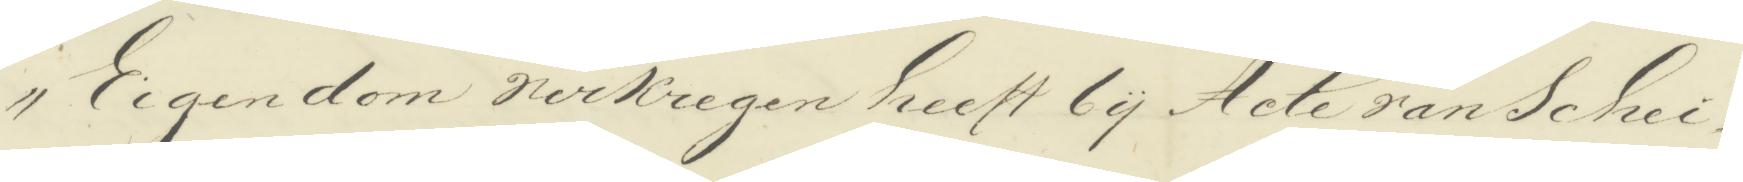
„ Eigendom verkregen heeft bij Acte van Schei„
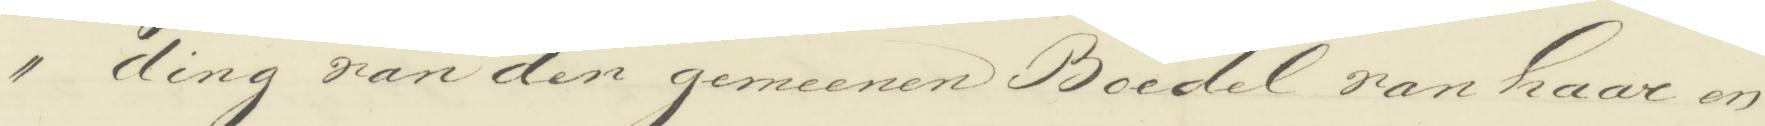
„ ding van den gemeenen Boedel van haar en
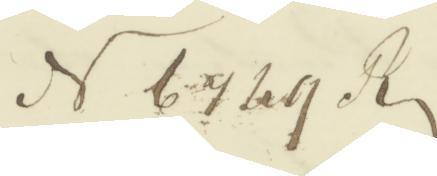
N 6749 R
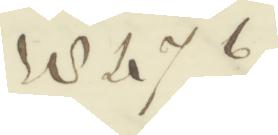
1847 6/24
